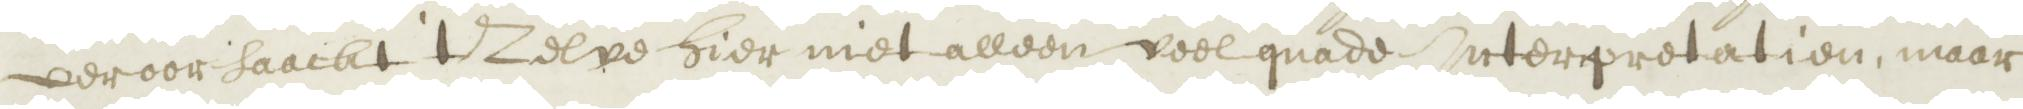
veroorsaackt ’t zelve hier niet alleen veel quade Jnterpretatien, maar
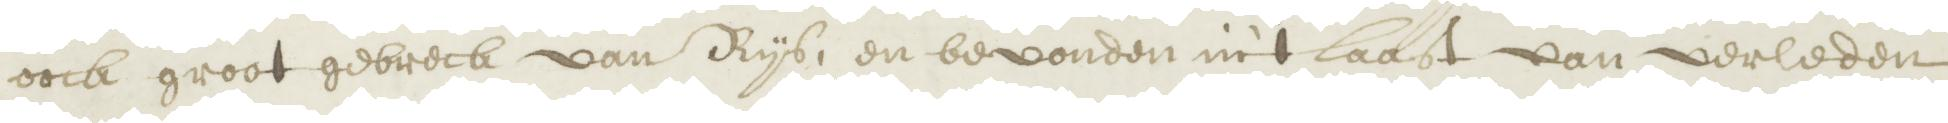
oock groot gebreck van Rijs, en bevonden in ’t laast van verleden
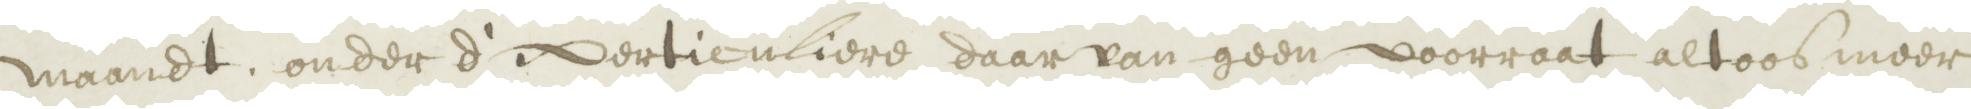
maandt, onder d’ perticuliere daar van geen voorraat altoos meer
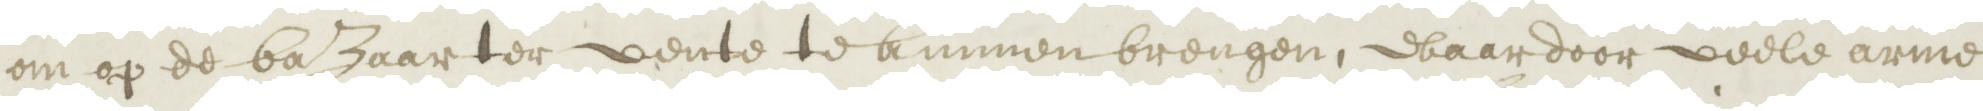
om op de baZaar ter vente te kunnen brengen, waardoor veele arme
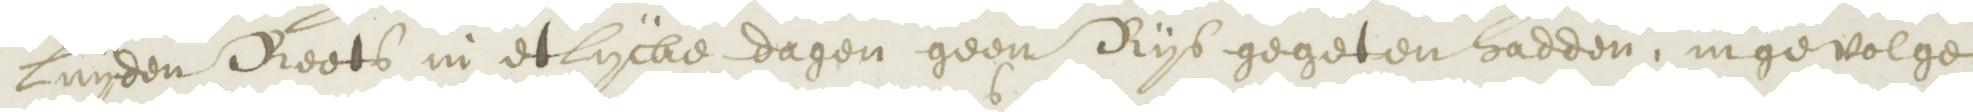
Luijden Reets in etlijcke dagen geen Rijs gegeten hadden, ingevolge
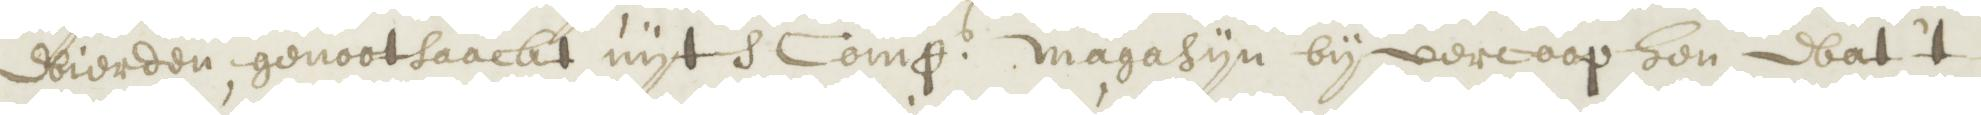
wierden genootsaackt uijt ’s Comp.s magasijn bij vercoop hen wat ’t
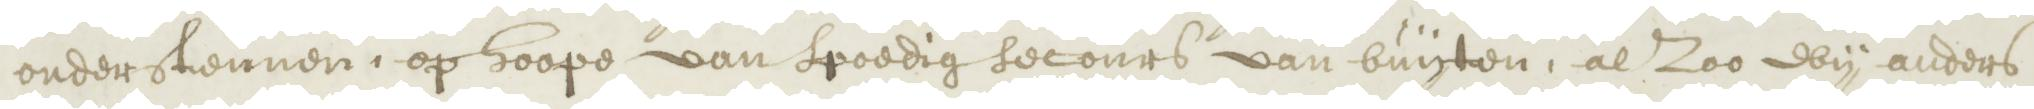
ondersteunen, op hoope van spoedig secours van buijten, al zoo wij anders
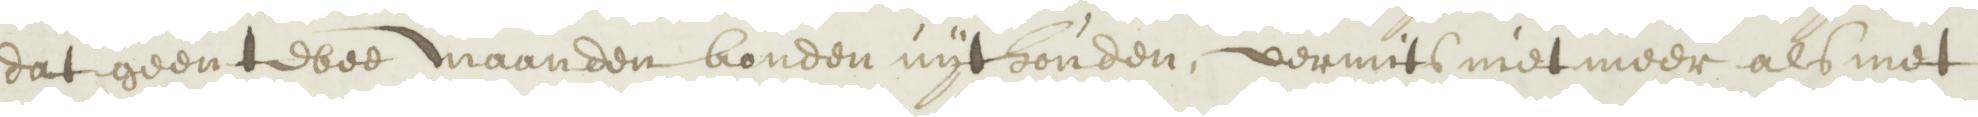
dat geen twee maanden konden uijthouden, vermits niet meer als met
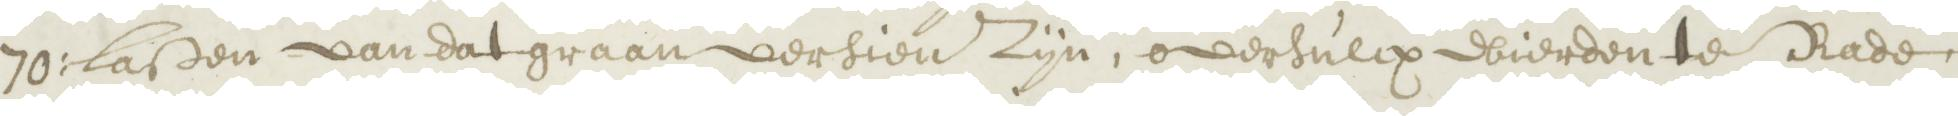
70: lasten van dat graan versien zijn, oversulcx wierden te Rade
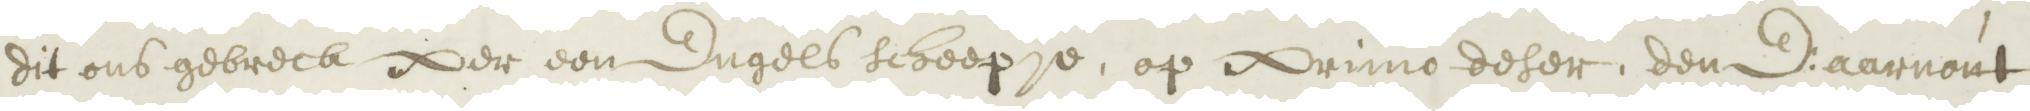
dit ons gebreck per een Engels scheepje, op primo deser, den E: aarnout
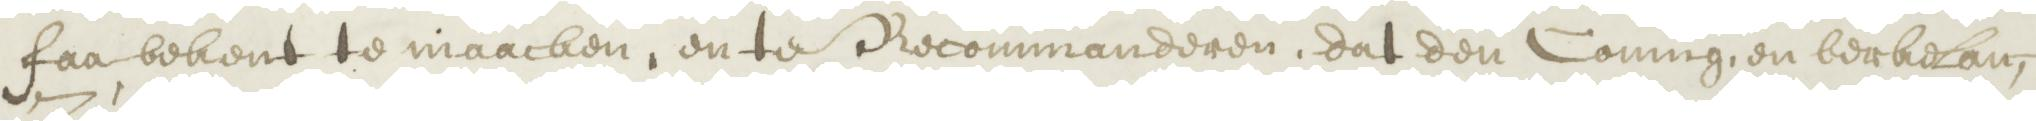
faa bekent te maacken, en te Recommanderen, dat den Coning, en berkelan,
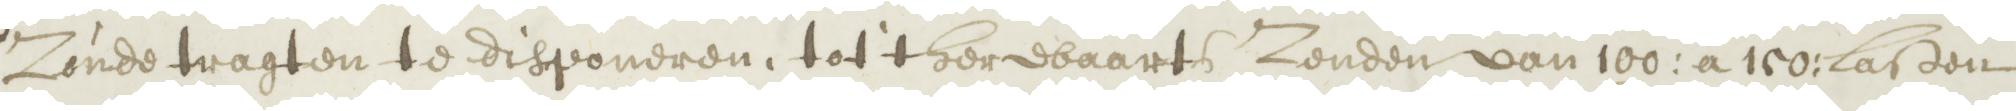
zoude tragten te disponeren, tot ’t herwaarts zenden van 100: â 150: Lasten
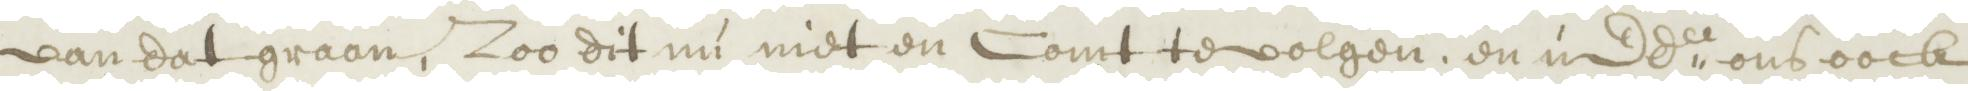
van dat graan, zoo dit nu niet en Comt te volgen. en u Ed„le ons oock
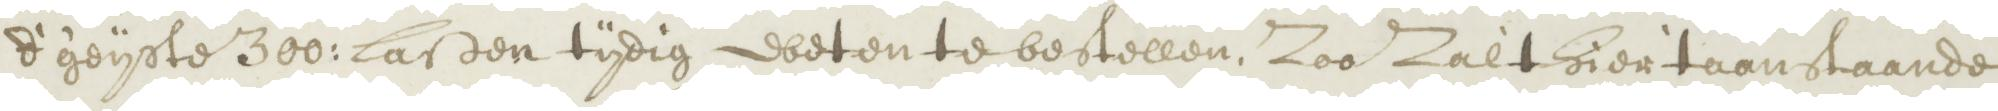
d’ g'eijste 300: Lasten tijdig weten te bestellen, zoo zal 't hier 't aanstaande
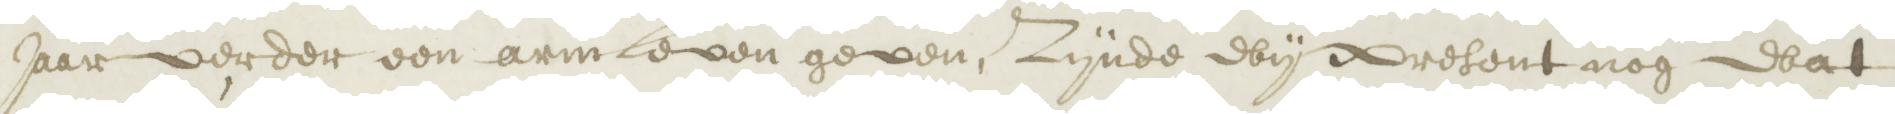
Jaar verder een arm Leven geven, zijnde wij present nog wat
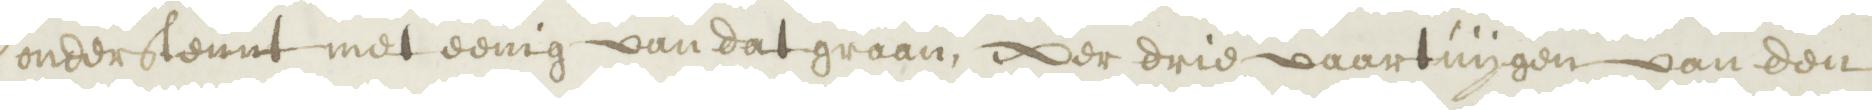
ondersteunt met eenig van dat graan, per drie vaartuijgen van den
